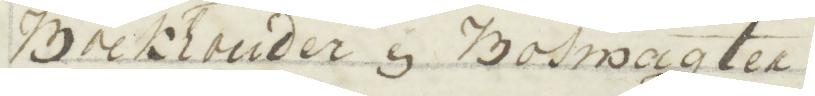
Boekhouder en Boswagter
